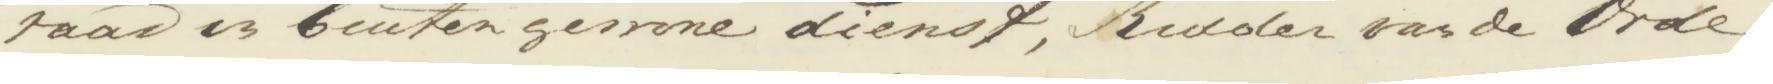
raad in buiten gewone dienst, Ridder van de orde
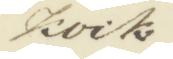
Kock
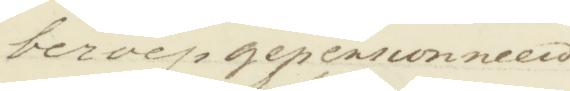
beroep gepensionneerd
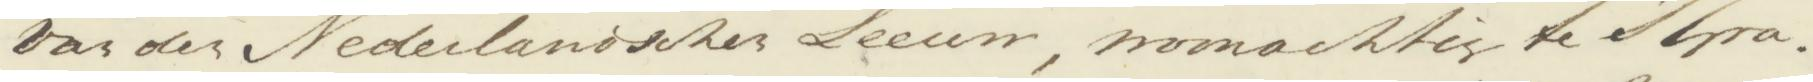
van den Nederlandschen Leeuw, woonachtig te 's Gra
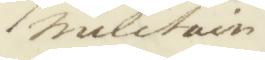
militair
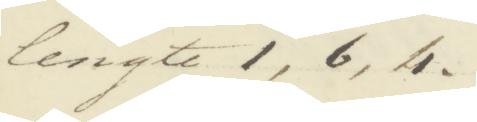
lengte 1, 6, 4.
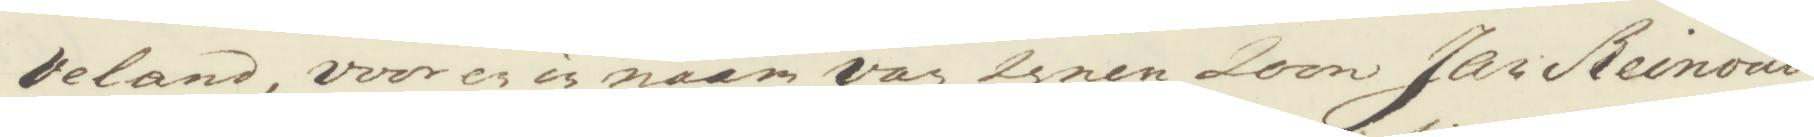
veland, voor en in naam van zynen zoon Jan Reinoud
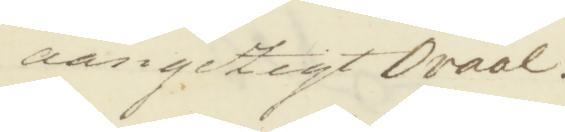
aangezigt Ovaal.
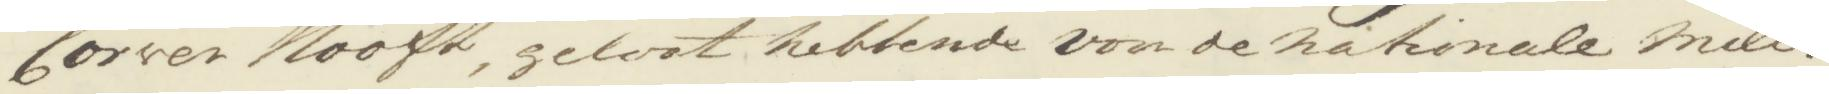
Corver Hooft, geloot hebbende voor de nationale mili.
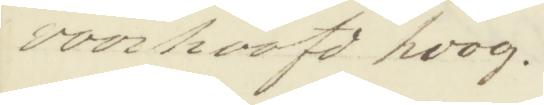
voorhoofd hoog.
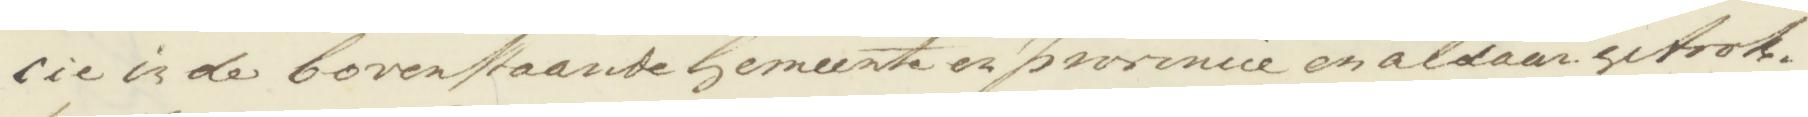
cie in de bovenstaande Gemeente en Provincie en aldaar getrok„
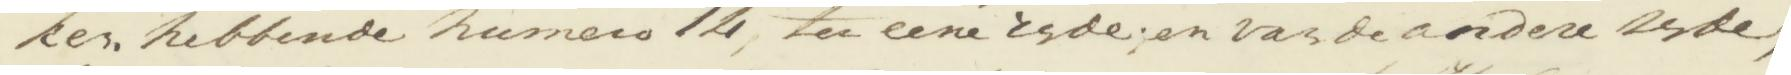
ken hebbende numero 14, ter eene zyde, en van de andere zyde,
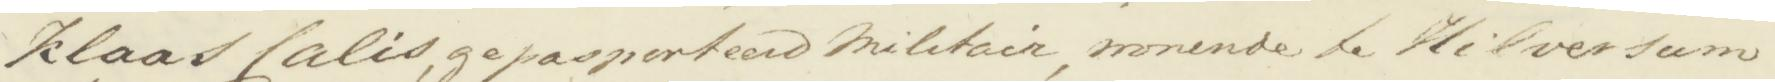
Klaas Calis, gepasporteerd militair, wonende te Hilversum
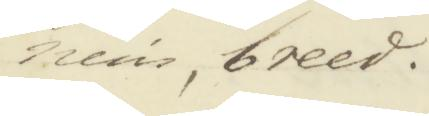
neus, breed.
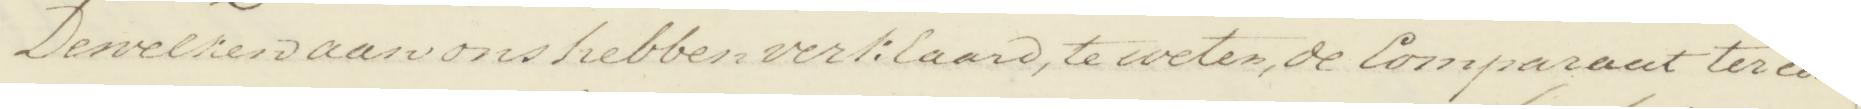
Dewelken aan ons hebben verklaard, te weten, de Comparant ter eenen
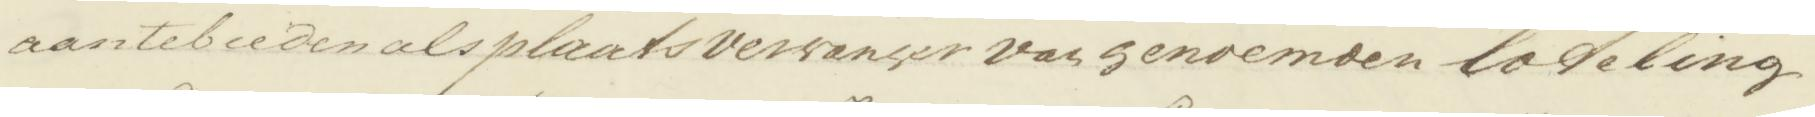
aantebieden als plaats vervanger van genoemden loteling
